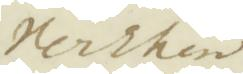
VerEken
